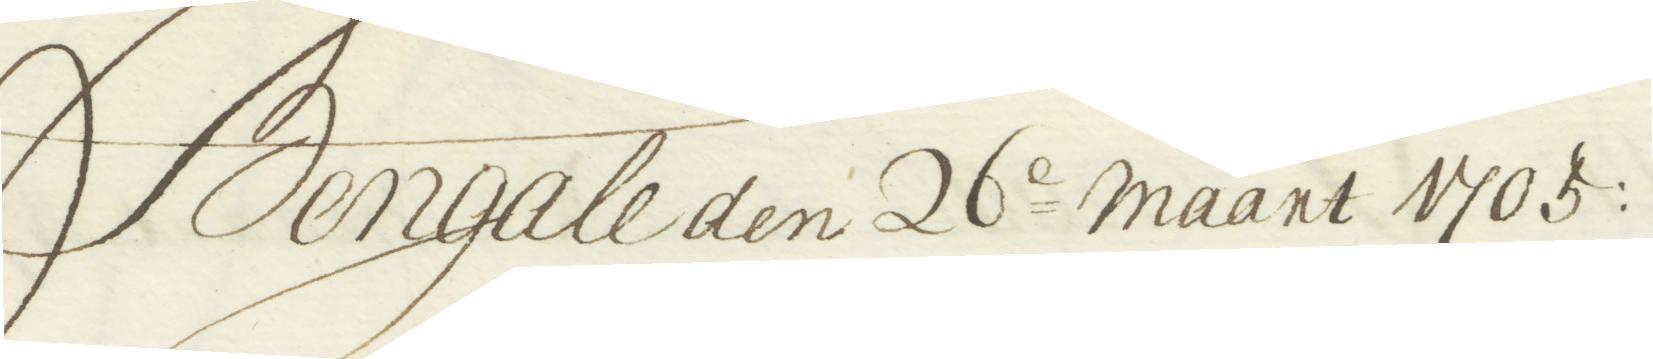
Van Bengale den 26=e maart 1705:
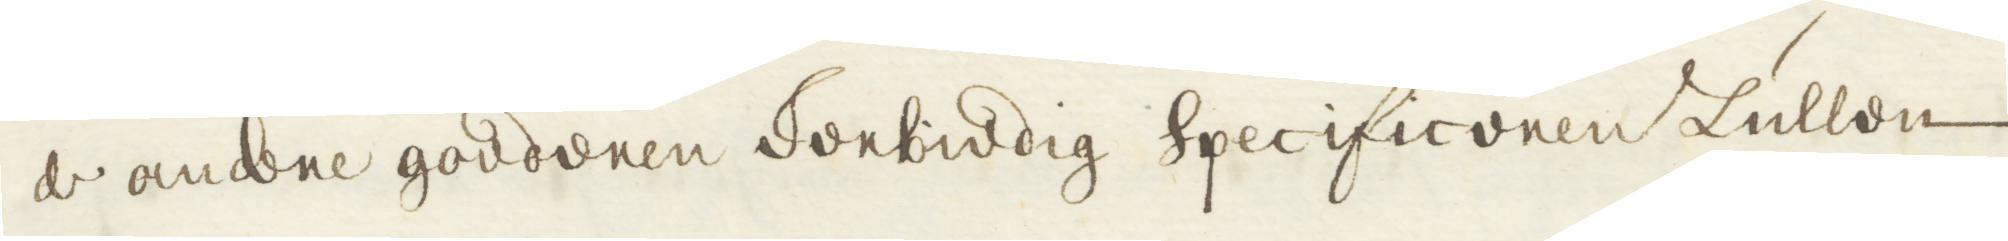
de andere goederen Eerbiedig specificeren zullen.
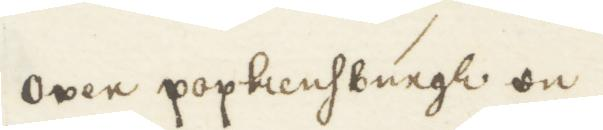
over popkensburgh en
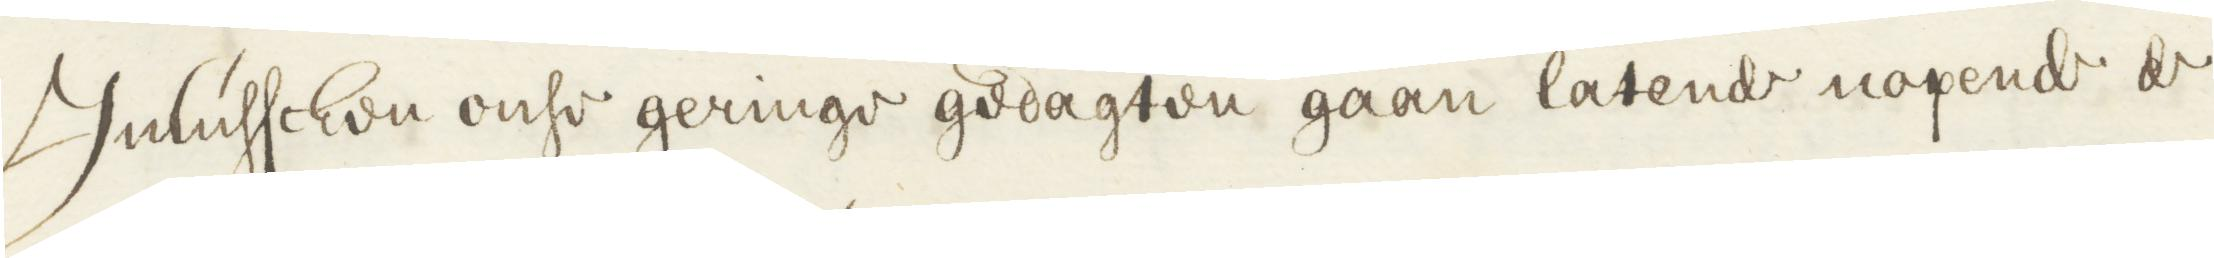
Intusschen onse geringe gedagten gaan latende nopende de
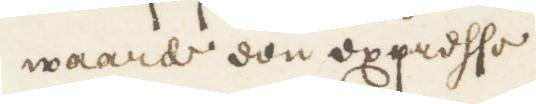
waarde een expresse
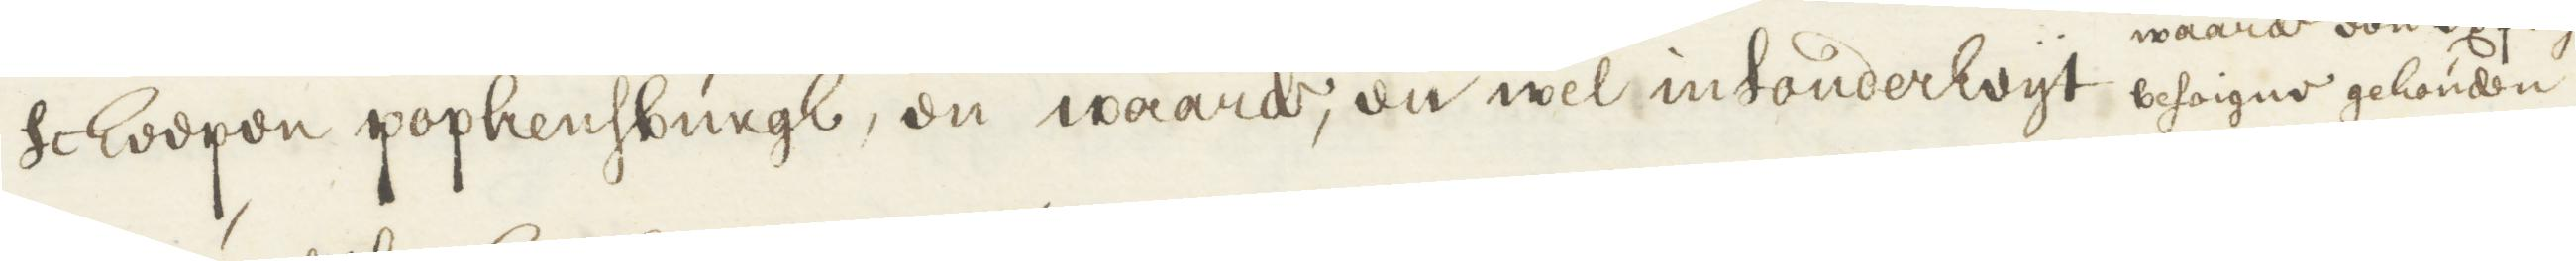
scheepen popkensburgh, en waarde, en wel insonderheijt besoigne gehouden
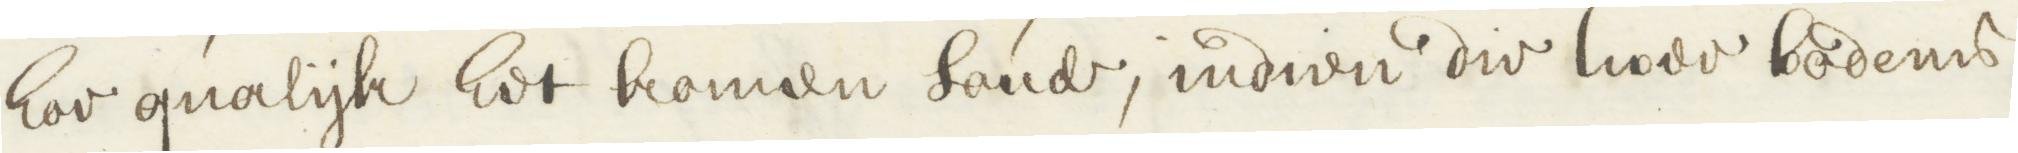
hoe qualijk het komen soude, indien die twee bodems
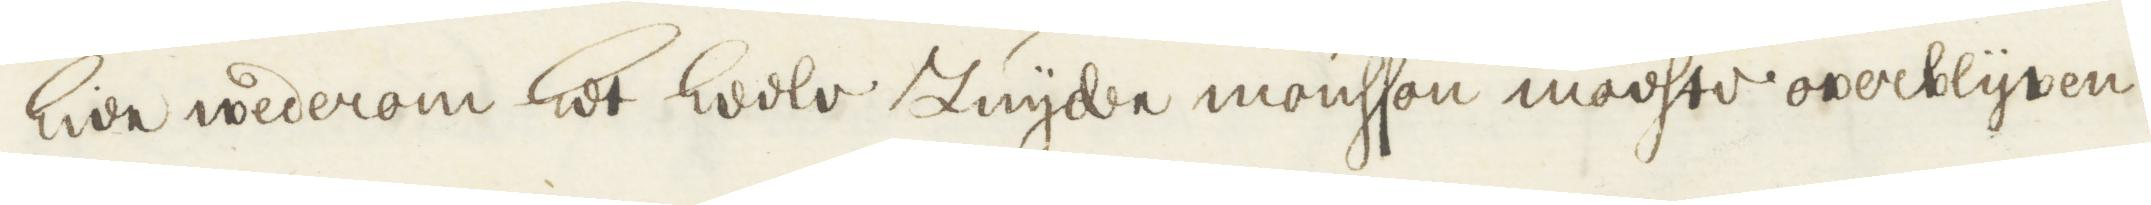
hier wederom het heele zuijder mousson moeste overblijven
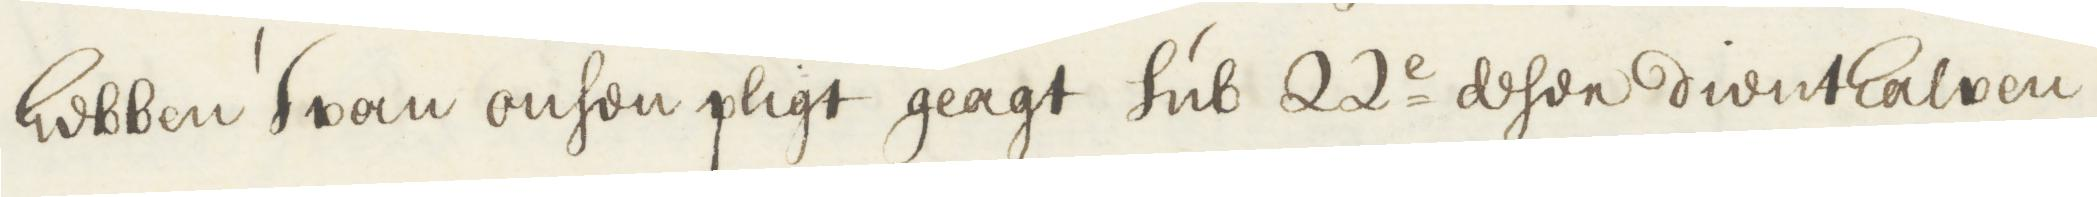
hebben 't van onsen pligt geagt sub 22=e deser dienthalven
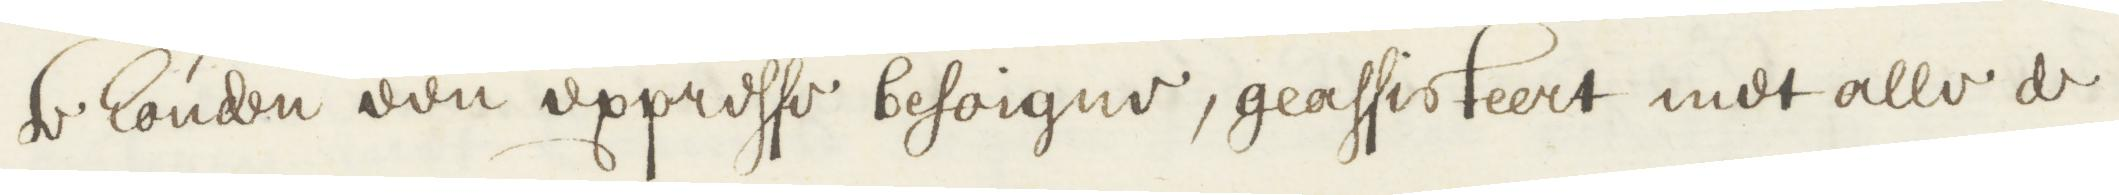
te houden een expresse besoigne, geassisteert met alle de
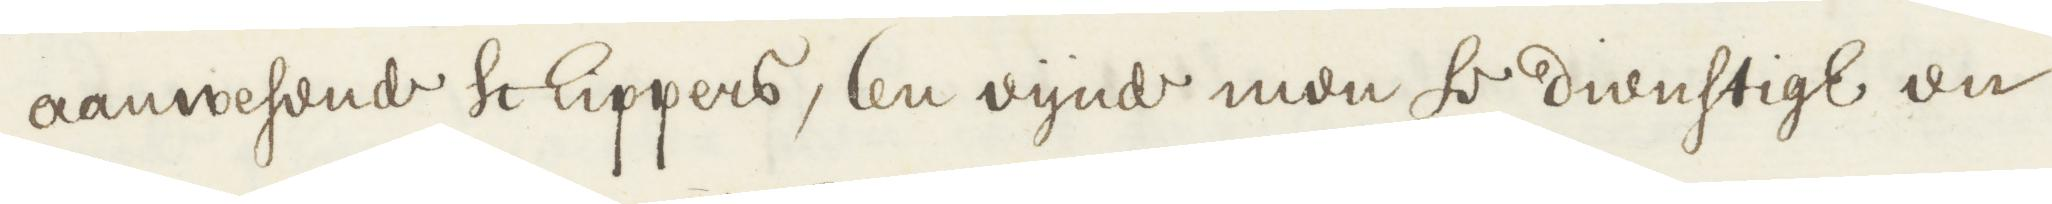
aanwesende schippers, ten eijnde men se dienstigh en
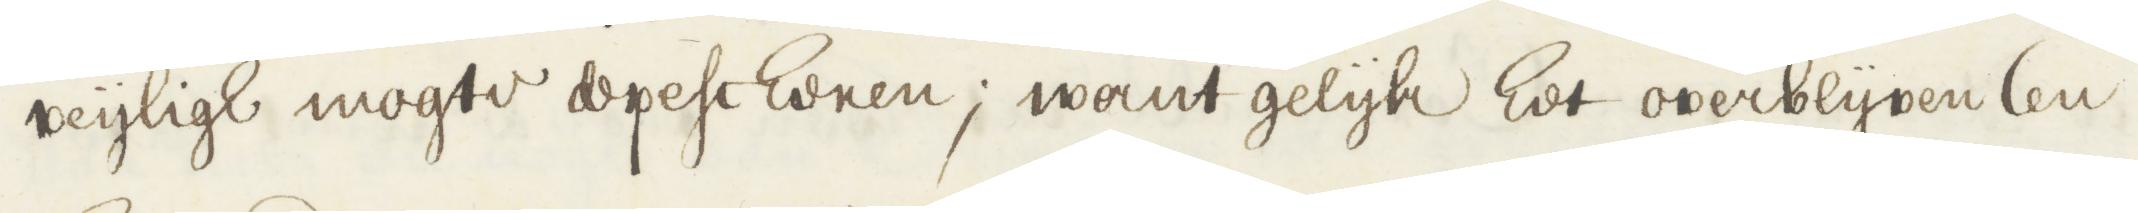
veijligh mogte depescheren; want gelijk het overblijven ten
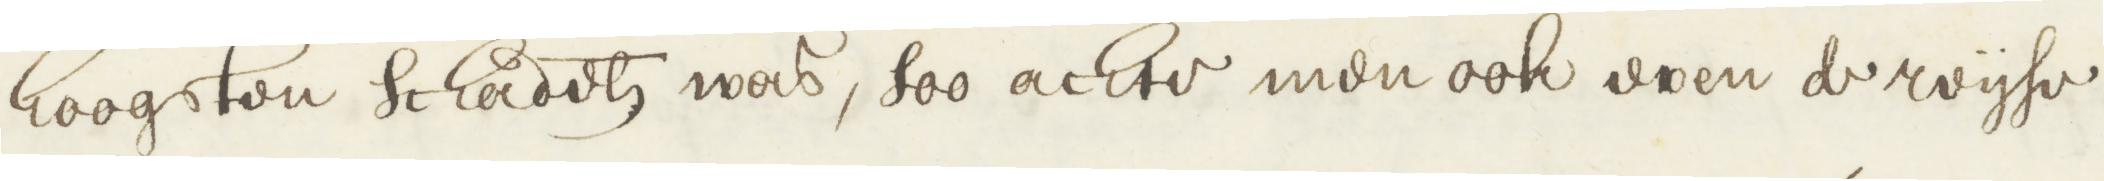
hoogsten schadelijk was, soo achte men ook even de reijse
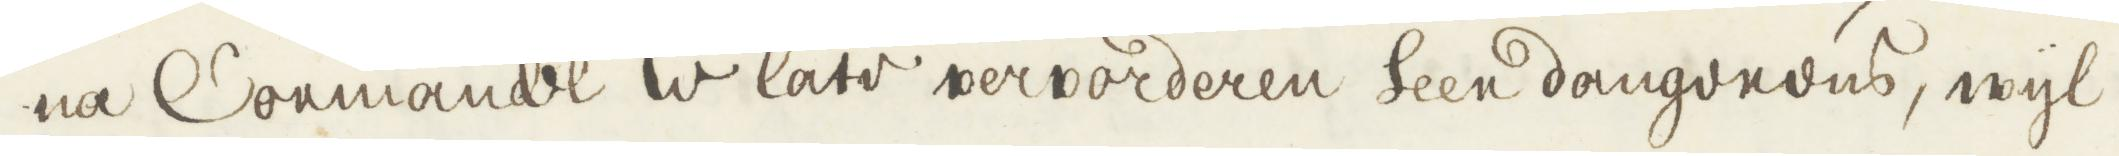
na Cormandel te late vervorderen seer dangereus, wijl
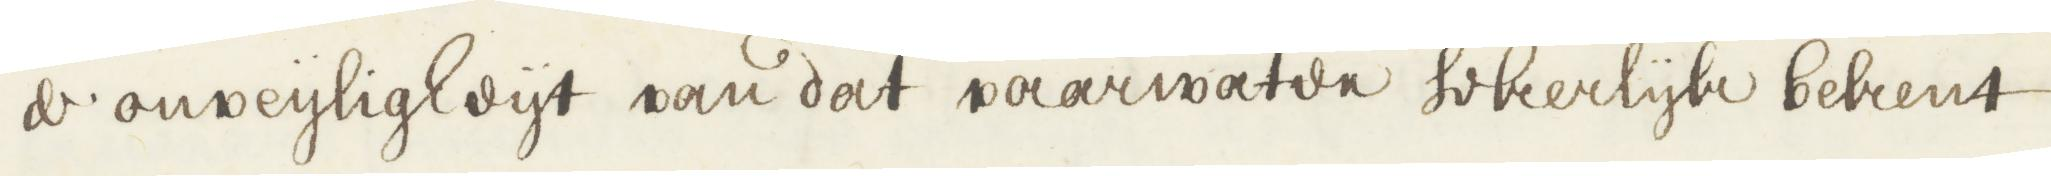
de onveijligheijt van dat vaarwater sekerlijk bekent
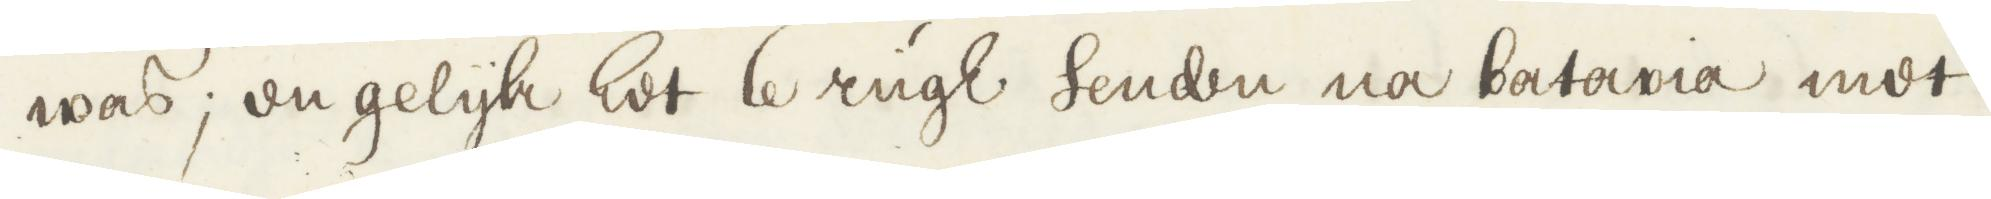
was; en gelijk het te rugh senden na batavia met
